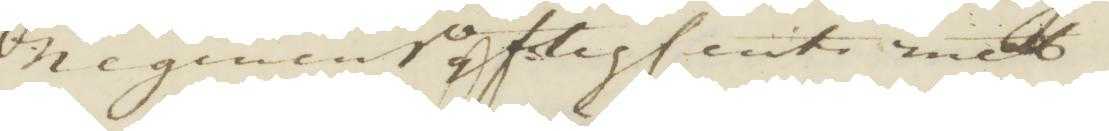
negenenvijftig cent met
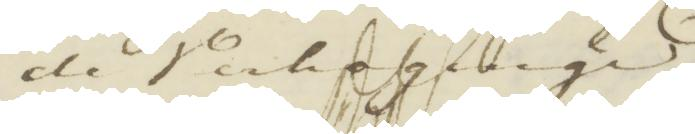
de Verhoginge
